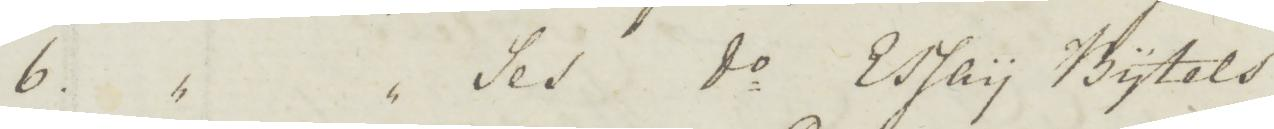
6. „ „ Ses d„o Essaij Bijtels
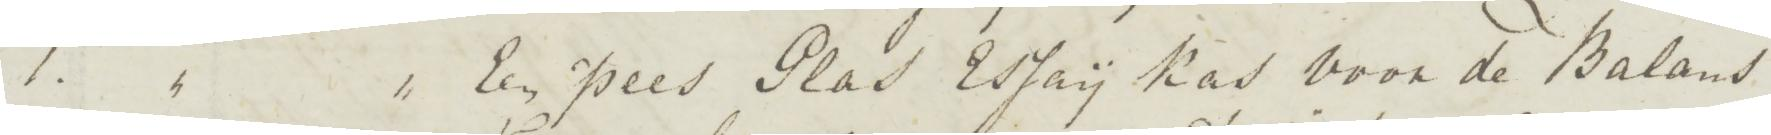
1. „ „ Een pees Plas Essaij Kas voor de Balans
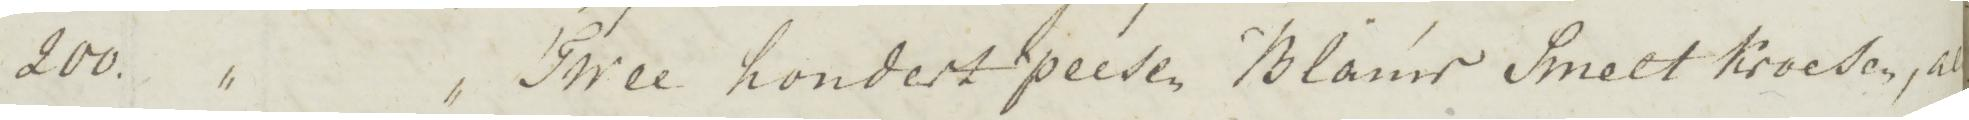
200. „ „ Twee hondert peesen Blauw Smelt Kroesen, al
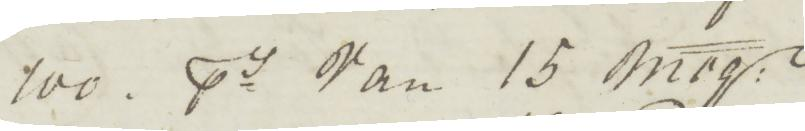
100. p=s Van 15 moq:s
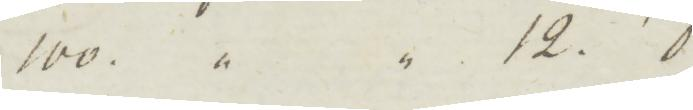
100. „ „ 12. d:o
